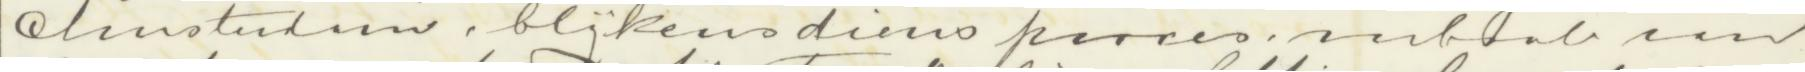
Amsterdam, blijkens diens proces-verbaal van
